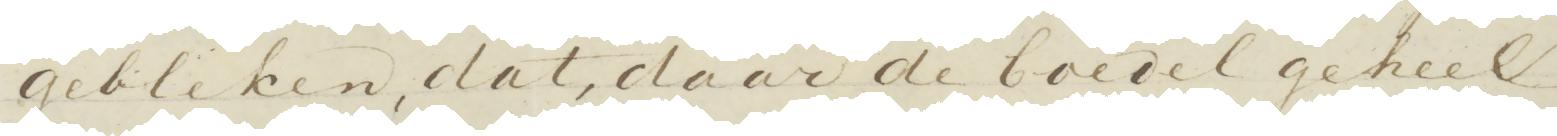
gebleken, dat, daar de boedel geheel
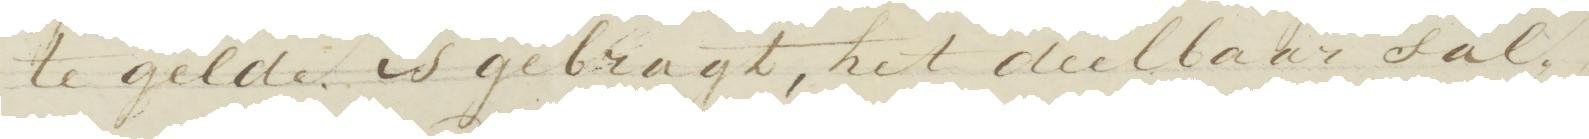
te gelde is gebragt, het deelbaar sal„
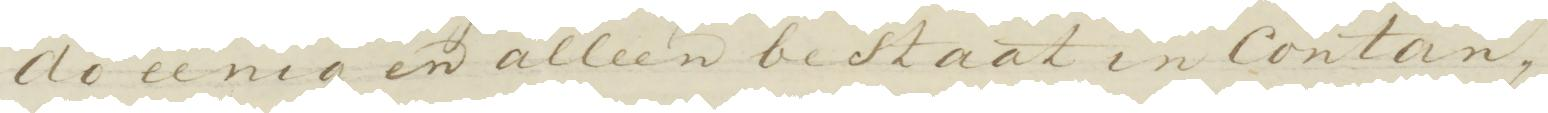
do eenig en alleen bestaat in contan„
